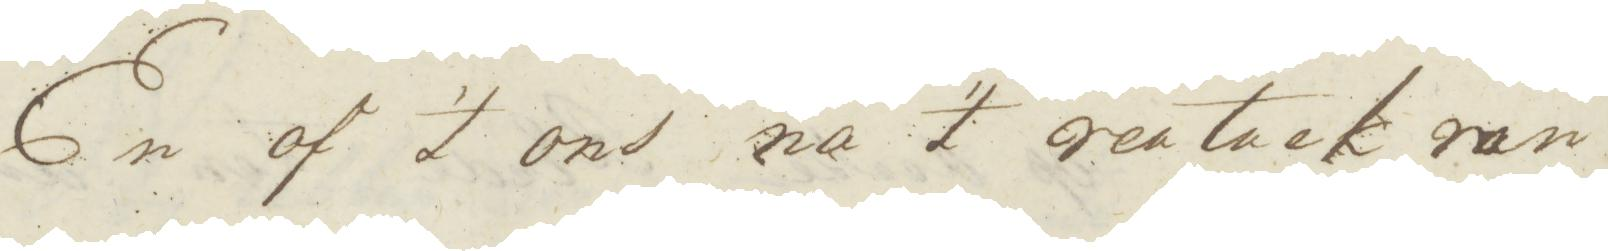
En of 't ons na ’t vertrek van
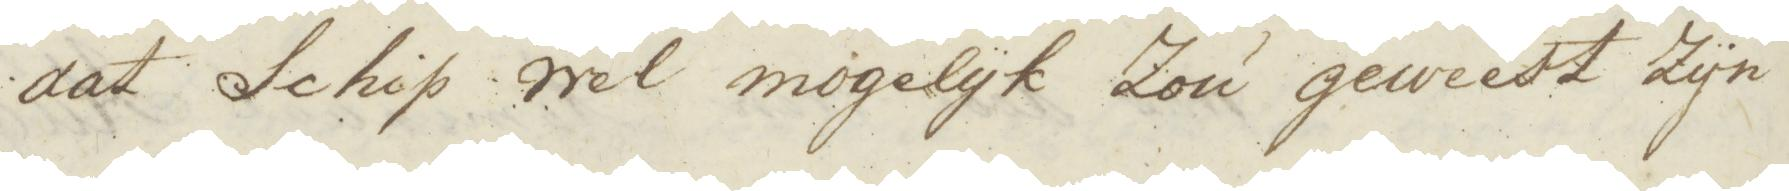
dat Schip wel mogelijk Zou geweest Zijn
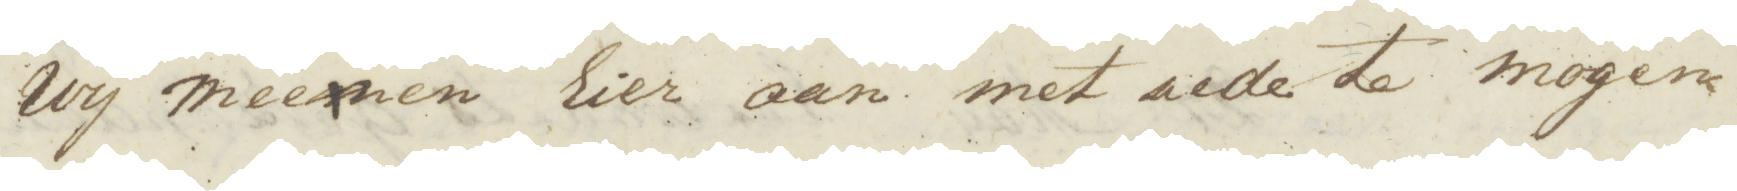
wy meenen hier aan met rede te mogen
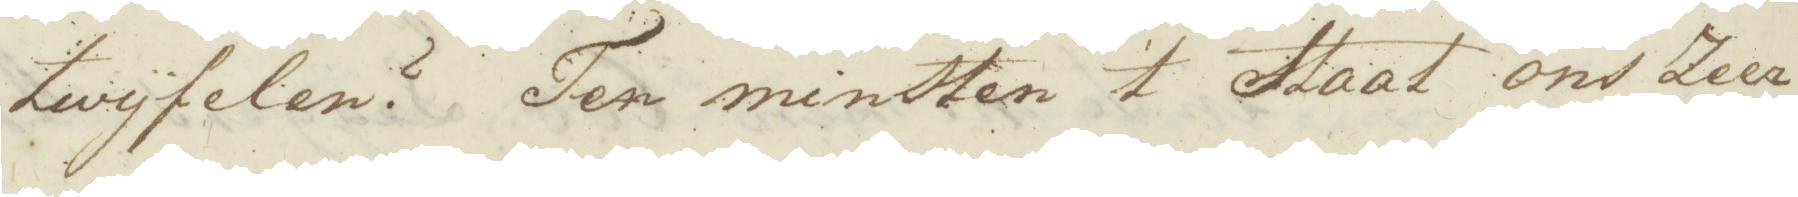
twijfelen? Ten minsten ’t Staat ons Zeer
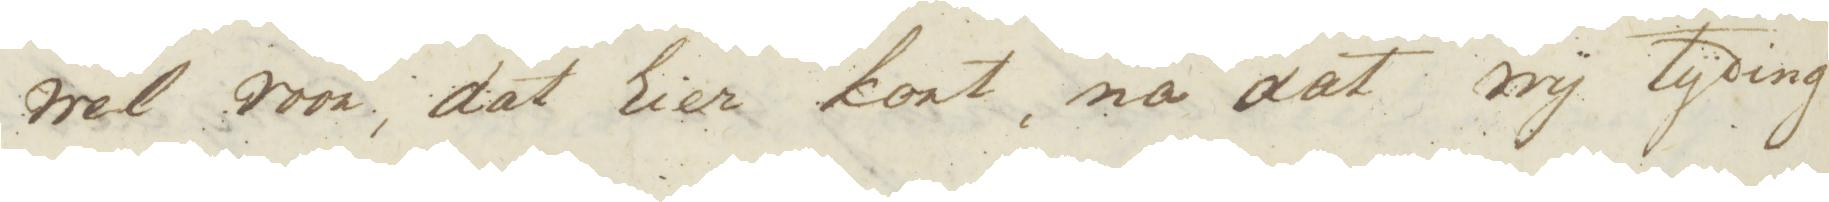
wel voor, dat hier kort, na dat wij tijding
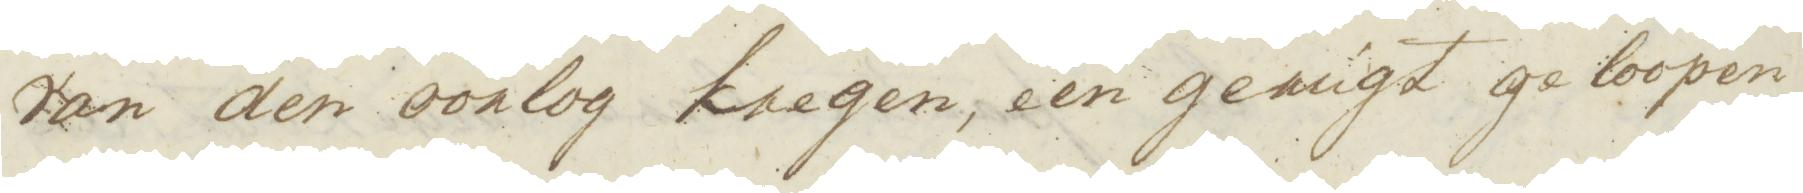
van den oorlog kregen, een gerugt geloopen
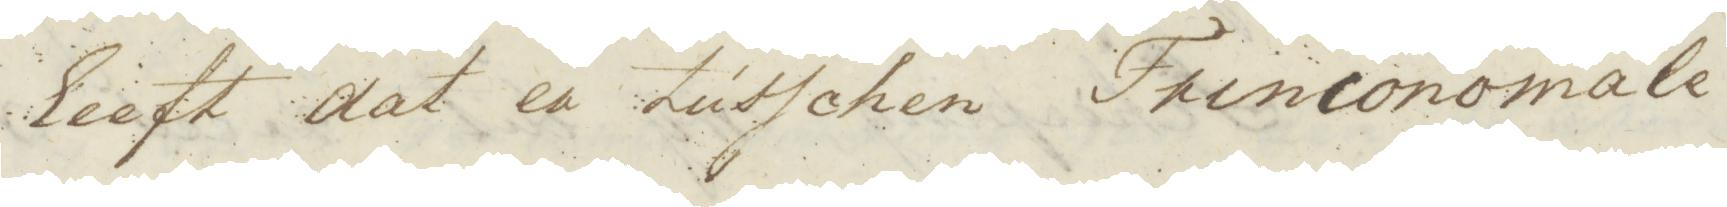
heeft dat er tusschen Trinconomale
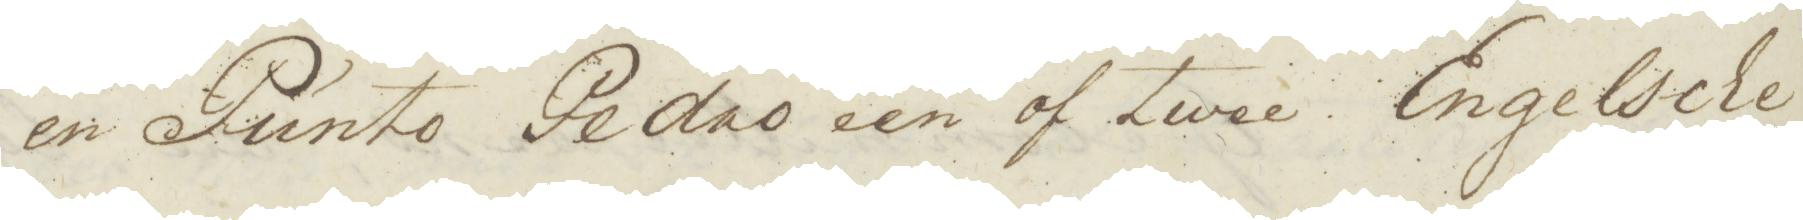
en Punto Pedro een of twee Engelsche
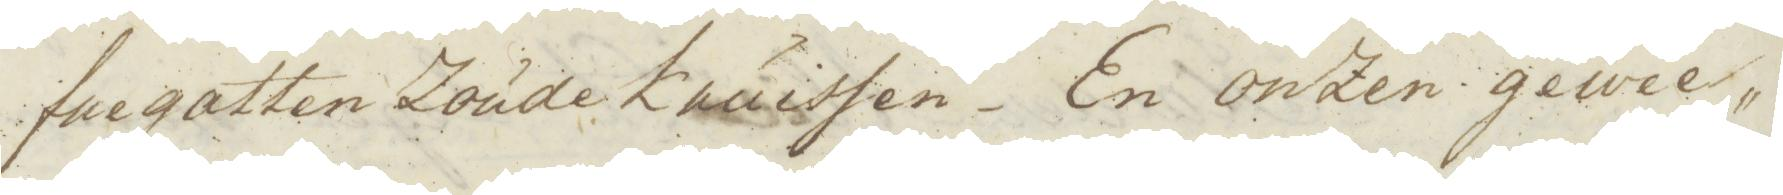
fregatten Zoude kruissen - En onzen: gewee„
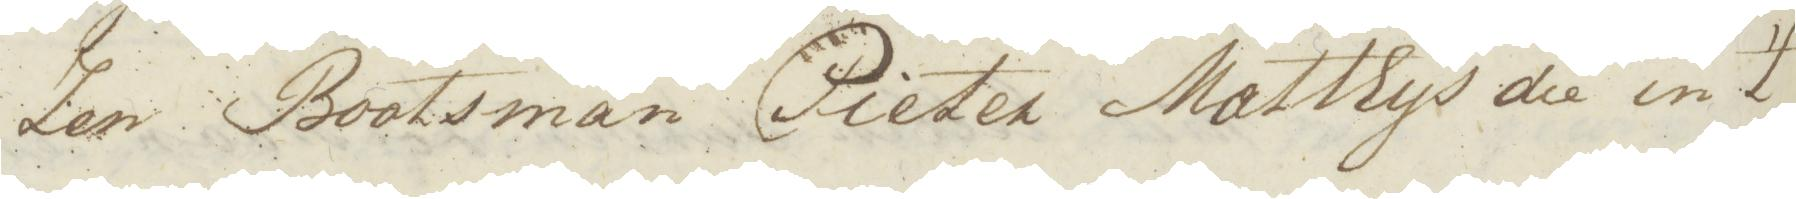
Zen Bootsman Pieter Matthijs die in 't
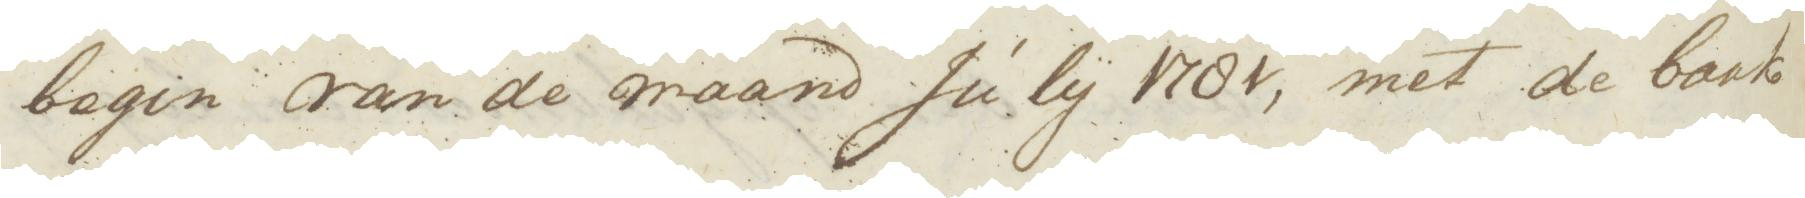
begin van de maand Julij 1781, met de bark
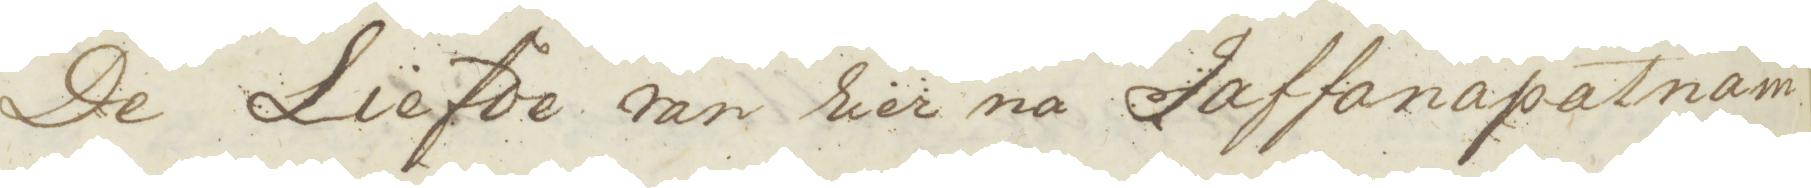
De Liefde van hier na Jaffanapatnam
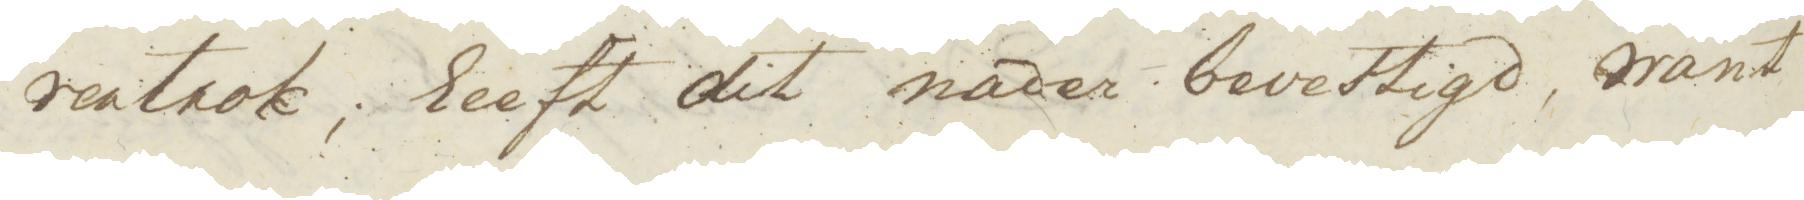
vertrok, heeft dit nader bevestigd, want
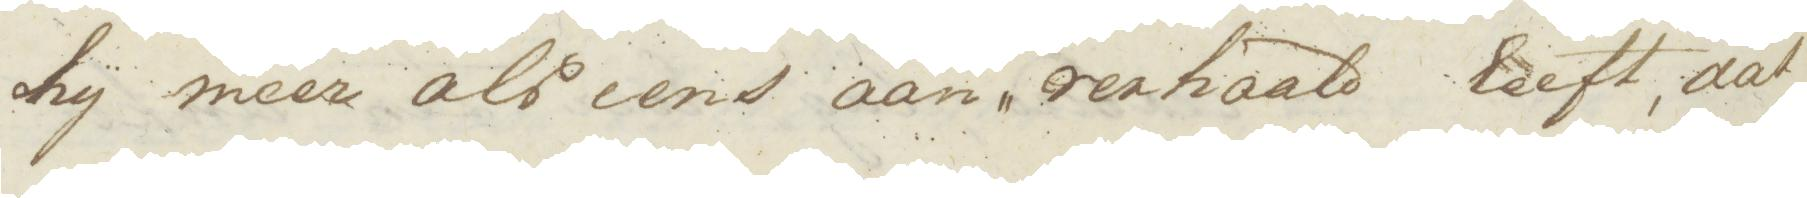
hij meer als eens aan „ verhaald heeft, dat
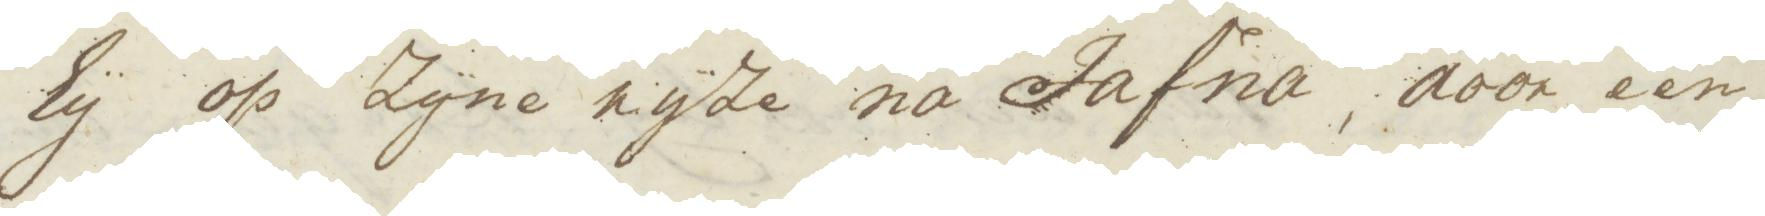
hij op zijne rijze na Jafna, door een
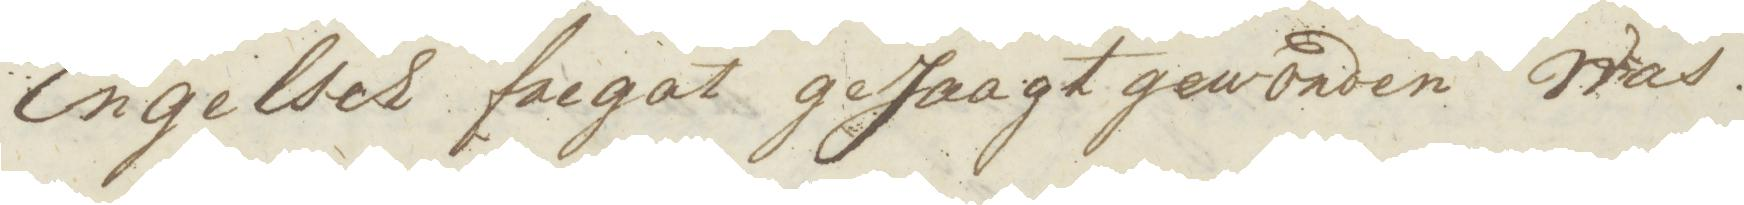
Engelsch fregat gejaagt geworden was
